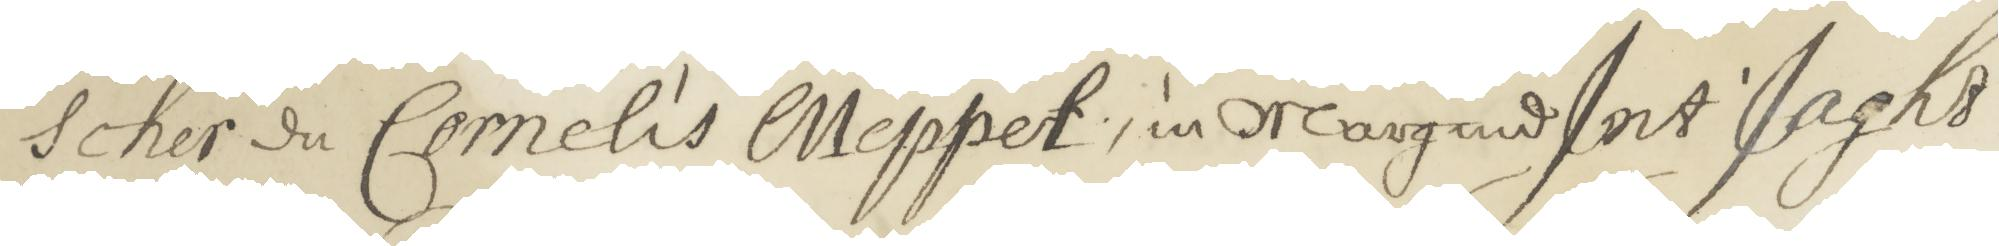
scher en Cornelis Meppel, in Margine Jnt' Jaght
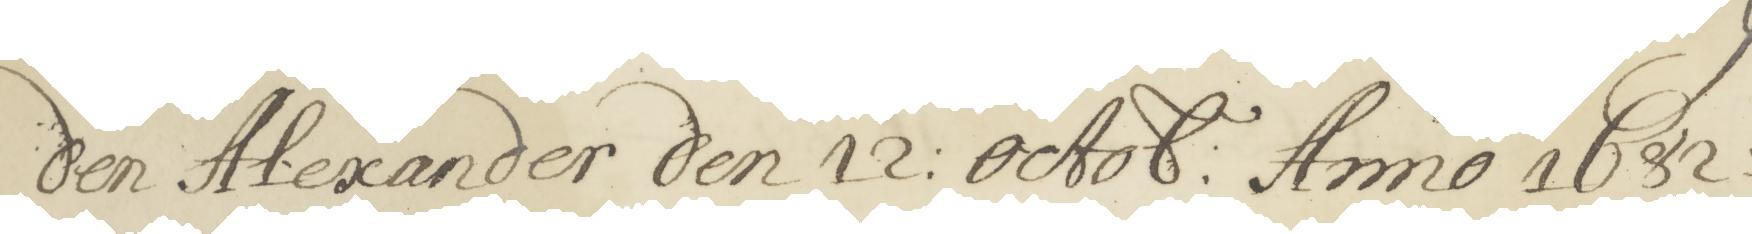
den Alexander den 12: octob: Anno 1682:
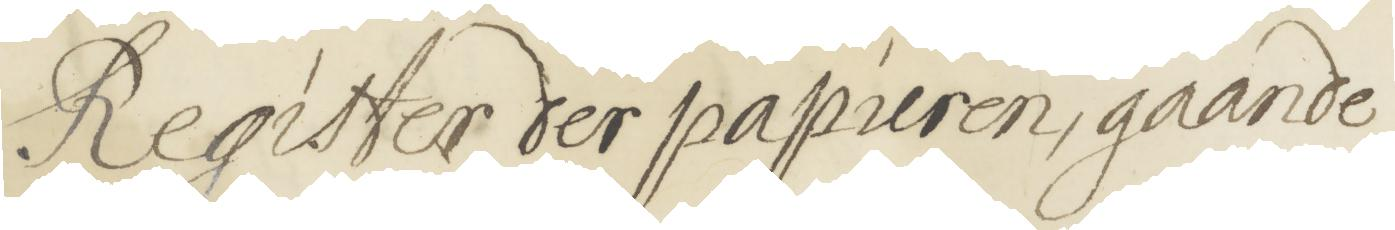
Register der papieren, gaande
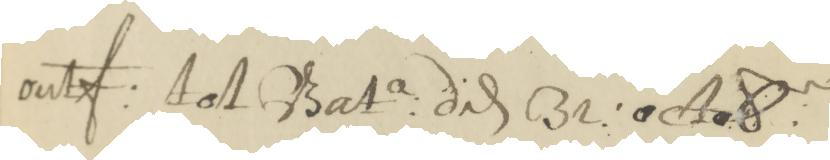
ontf: tot Bat:a den 31: octob:
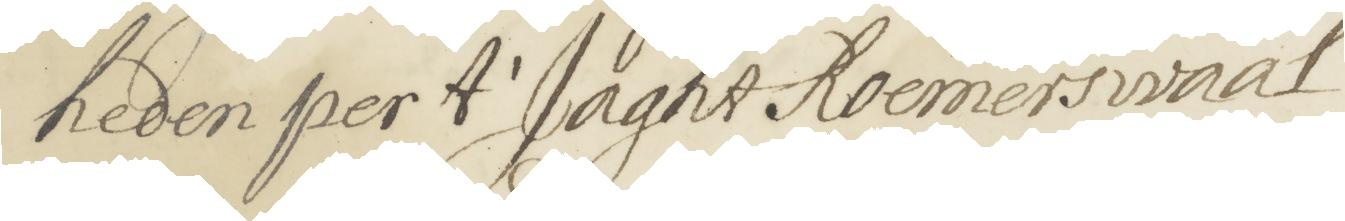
heden per t' Jaght Roemerswaal
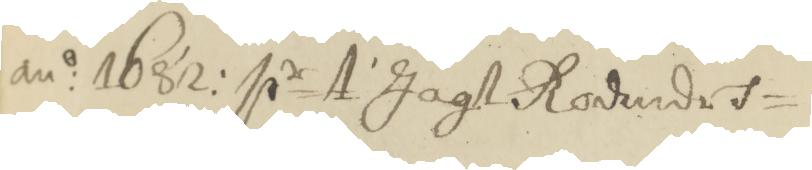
ano: 1682: p=r t' Jagt Roemers=
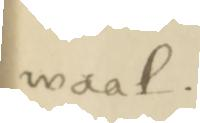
waal.
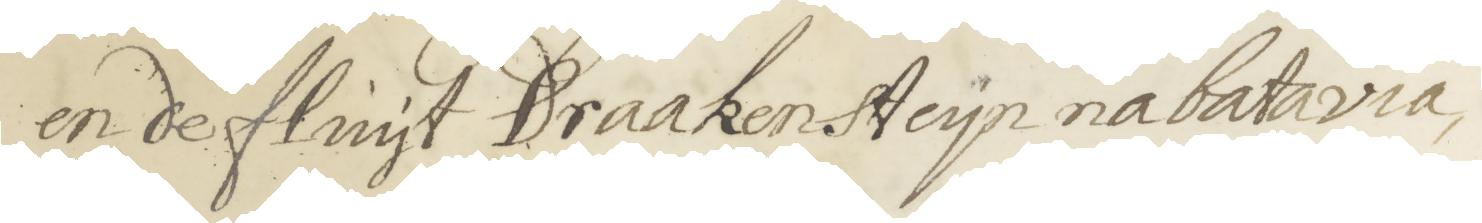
en de fluijt Draakensteijn na batavia,
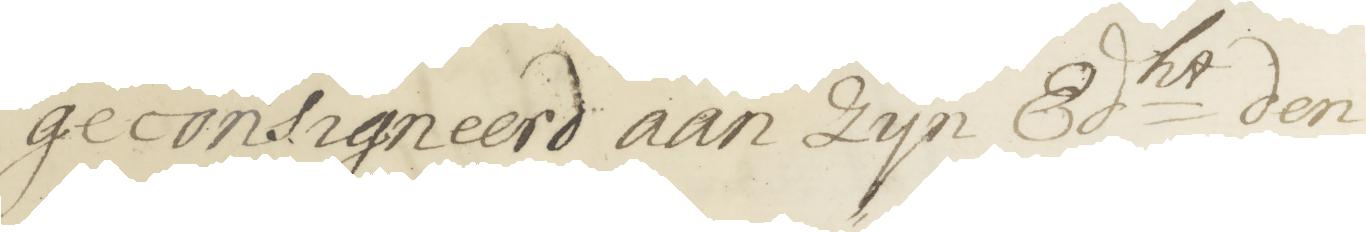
geconsigneerd aan zijn Ed=ht den
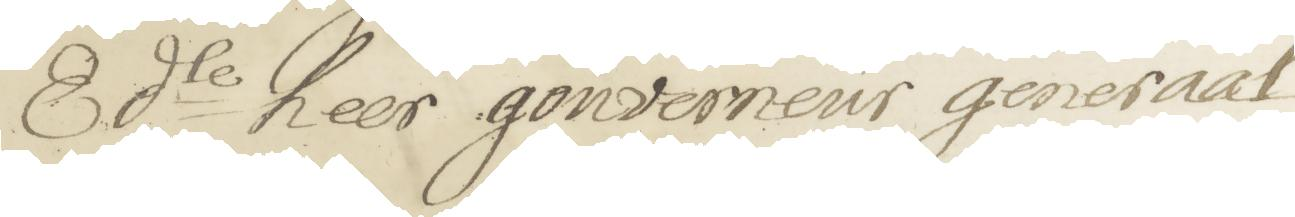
Ed=le heer gouverneur generaal
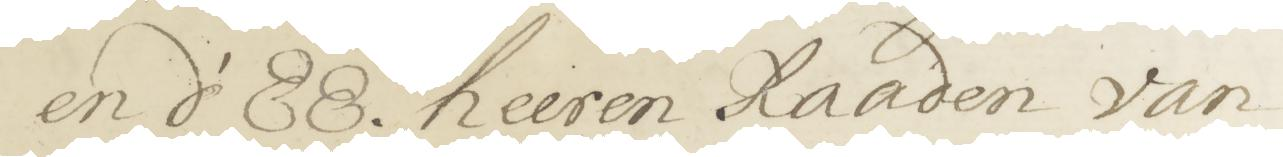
in d’ EE. heeren Raaden van
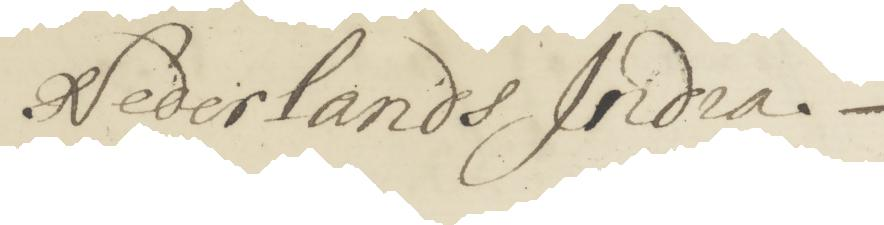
Nederlands Jndia.
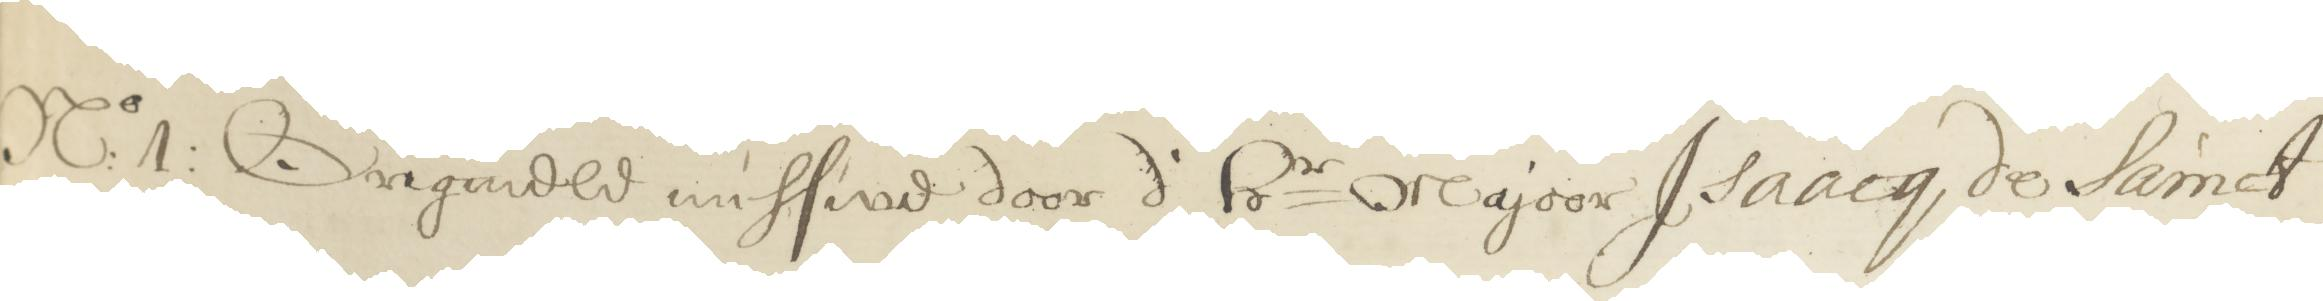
N:o 1: Originele missive door d’ h=r majoor Isaacq de Sainct
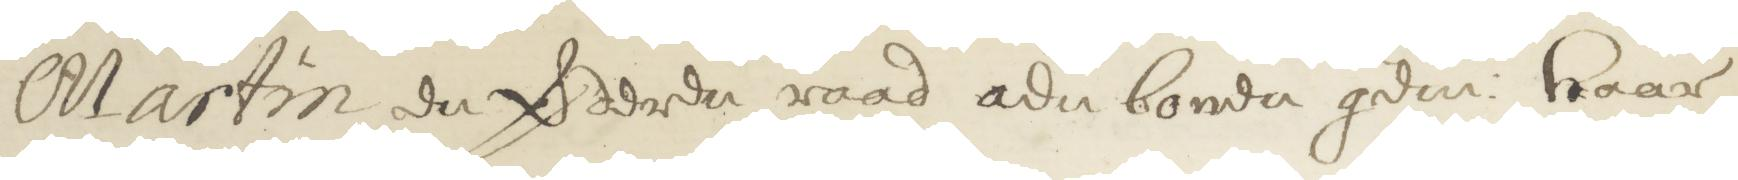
Martin en verderen raad aen boven gem: haar
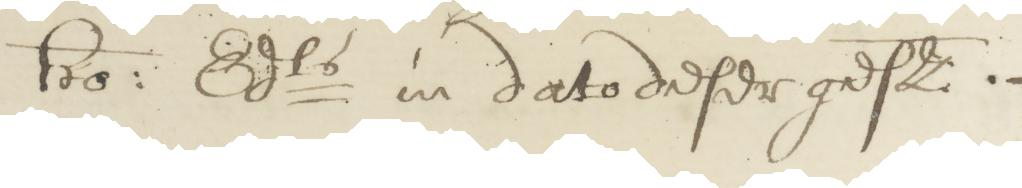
ho: Ed=ls in dato deser gesz.—
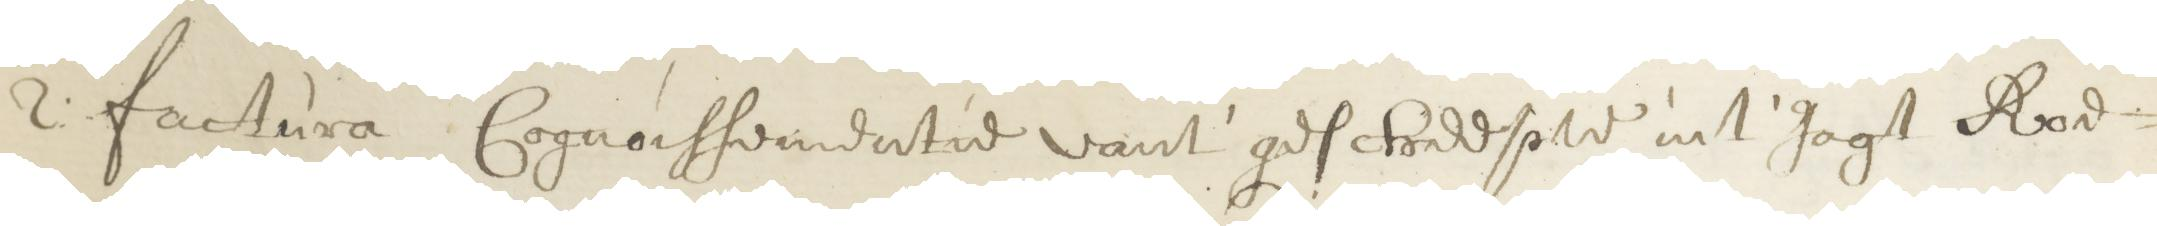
2: factura Cognoissementie vant' gescheepte int' Jagt Roe=
